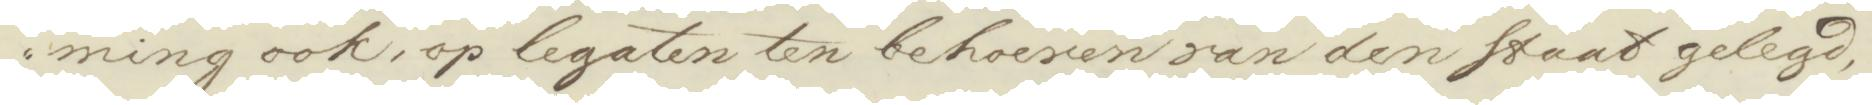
„ming ook, op legaten ten behoeven van den staat gelegd,
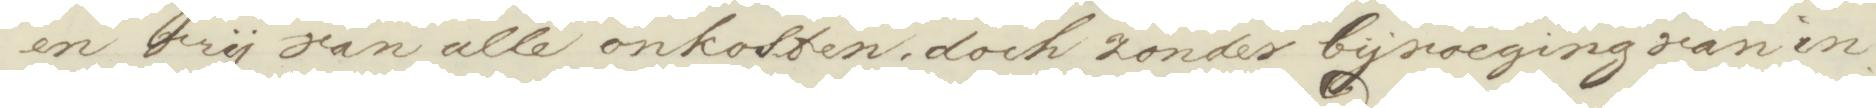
en vrij van alle onkosten, doch zonder bijvoeging van in
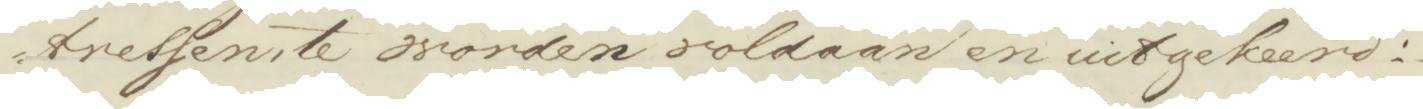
„tressen, te worden voldaan en uitgekeerd:
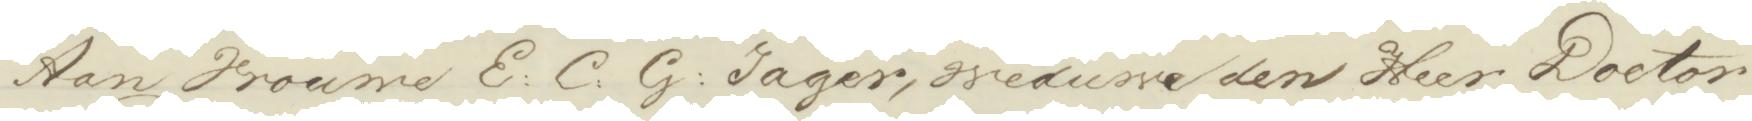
Aan Vrouwe E: C: G: Iager, weduwe den Heer Doctor
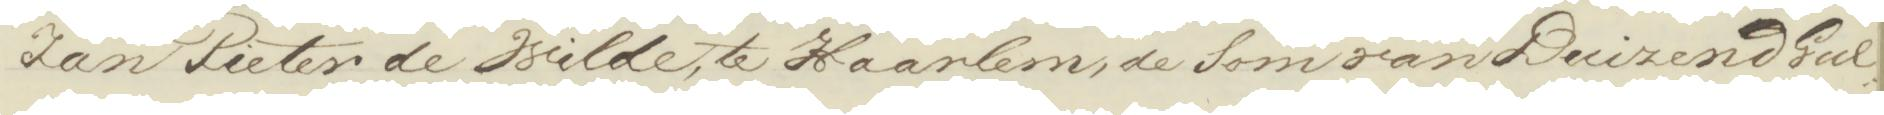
Ian Pieter de Wilde, te Haarlem, de som van Duizend Gul„
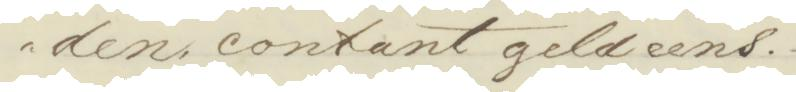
„den, contant geld eens.
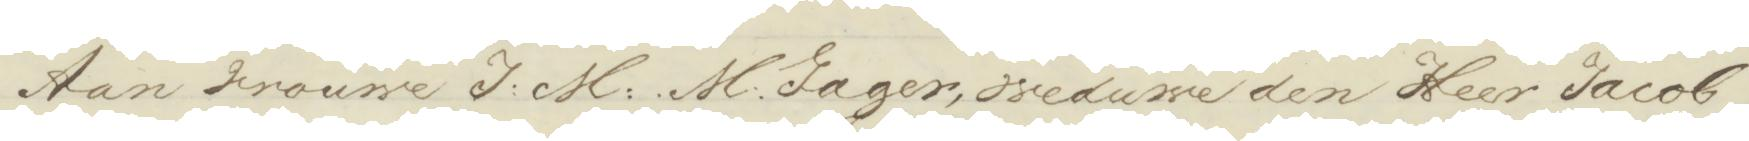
Aan Vrouwe I: M: M: Iager, weduwe den Heer Iacob
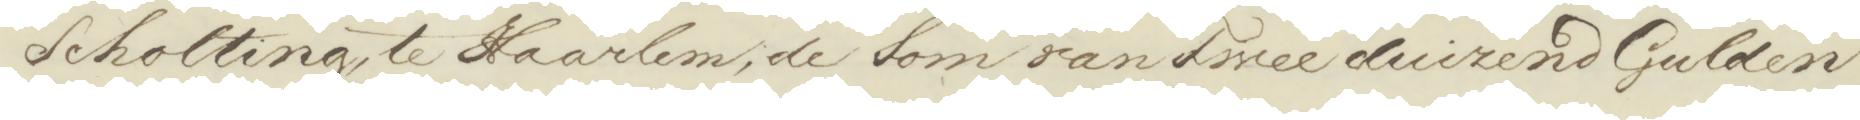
Scholting, te Haarlem, de som van Twee duizend Gulden
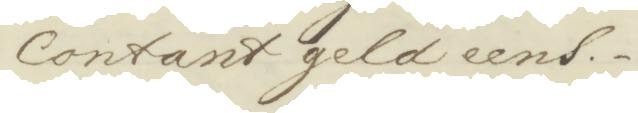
contant geld eens. -
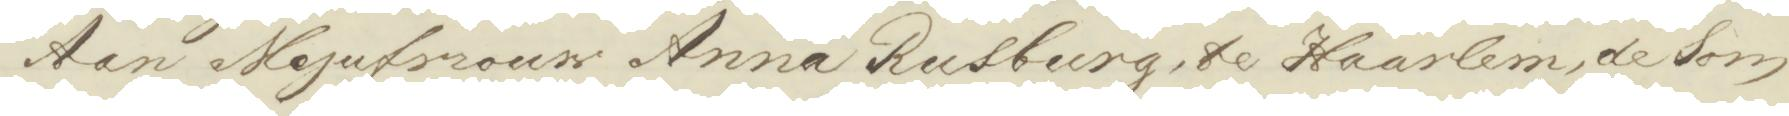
Aan Mejufvrouw Anna Rusburg, te Haarlem, de som
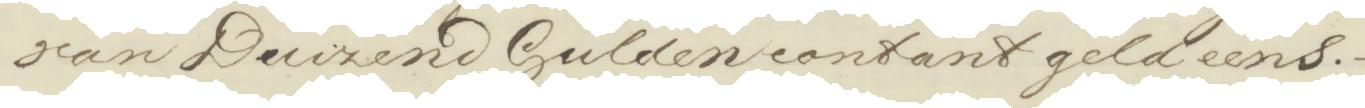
van Duizend Gulden contant geld eens.
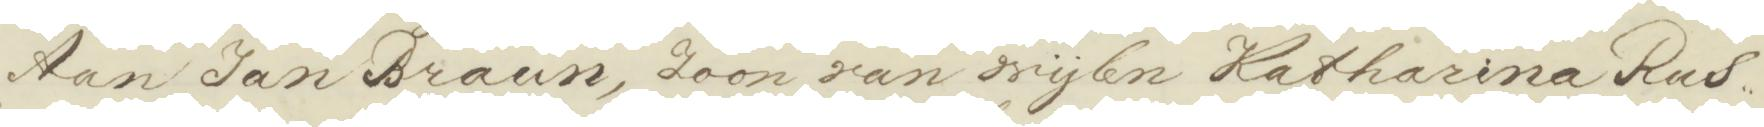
Aan Ian Braun, zoon van wijlen Katharina Rus„
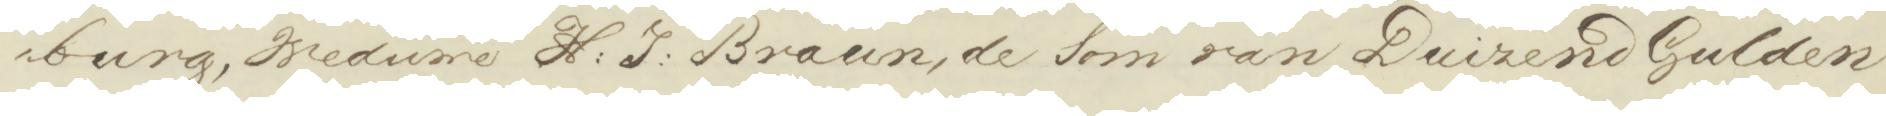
„burg, weduwe H: I: Braun, de som van Duizend Gulden
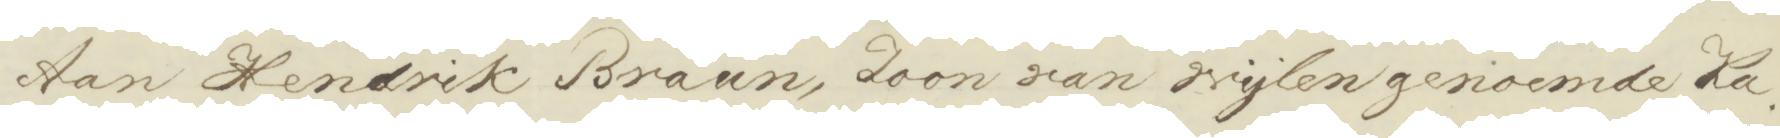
Aan Hendrik Braun, zoon van wijlen genoemde Ka
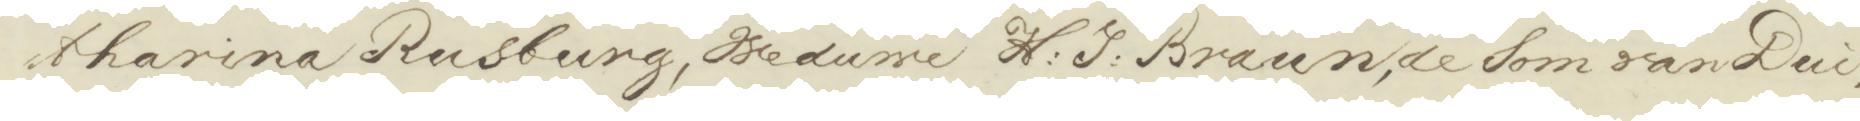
„tharina Rusburg, weduwe H: I: Braun, de Som van Dui
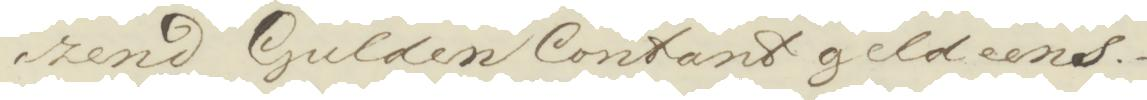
,zend Gulden Contant geld eens.
